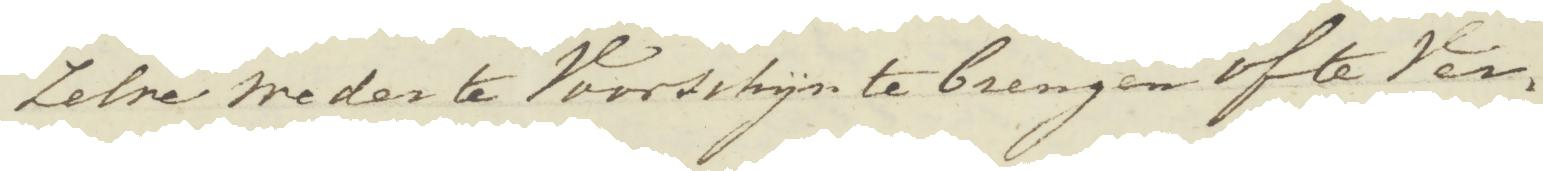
zelve weder te Voorschijn te brengen of te Ver„
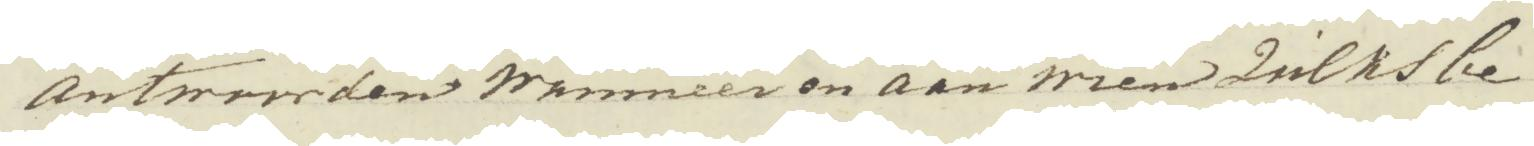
antwoorden wanneer en aan wien zulks be
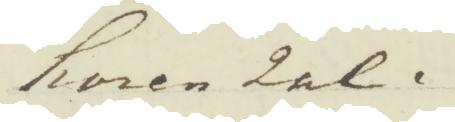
horen zal.
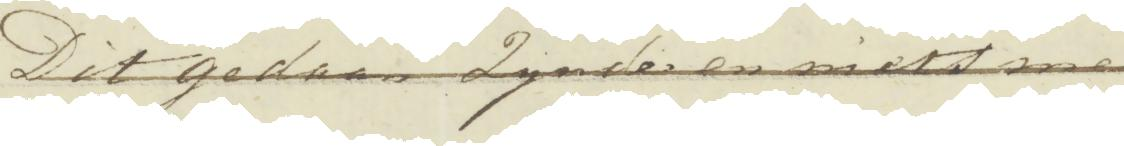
Dit gedaan zijnde en niets meerder ge
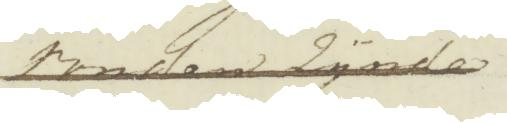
vonden zijnde
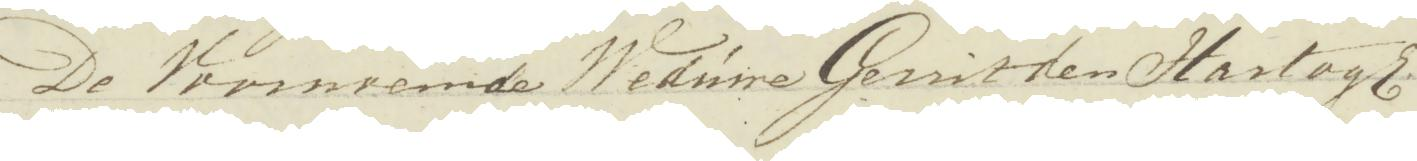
De Voornoemde Weduwe Gerrit den Hartogh
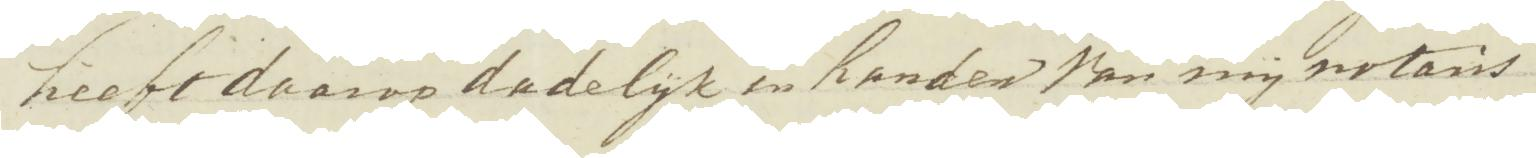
heeft daarop dadelijk in handen Van mij notaris
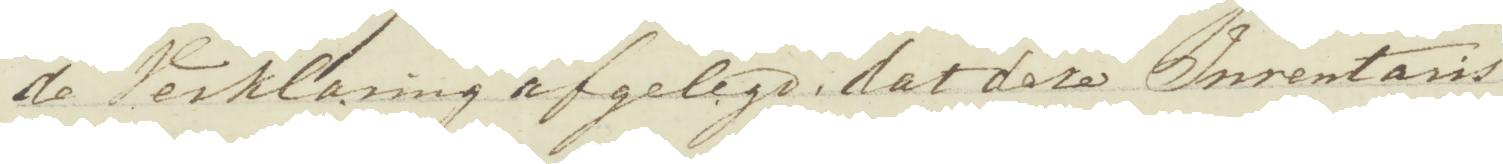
de Verklaring afgelegd, dat deze Inventaris
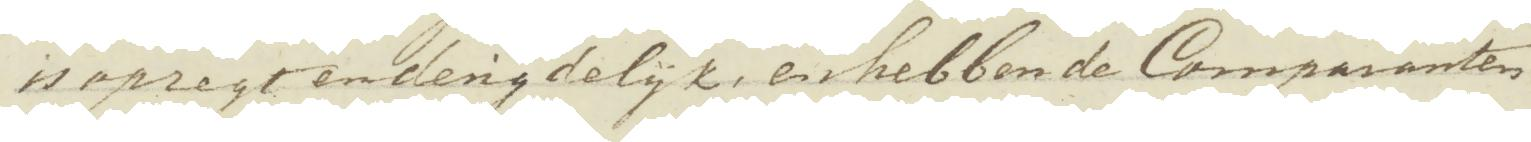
is opregt en deugdelijk, en hebbende Comparanten
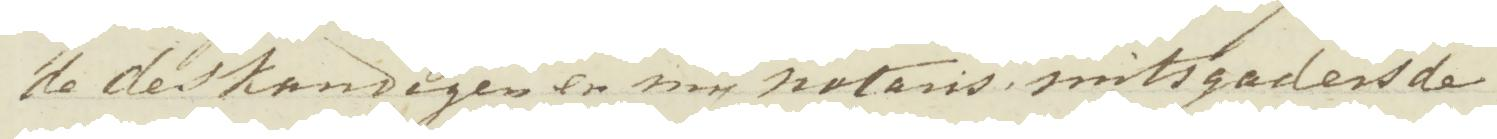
de deskundigen en mij notaris, mitsgaders de
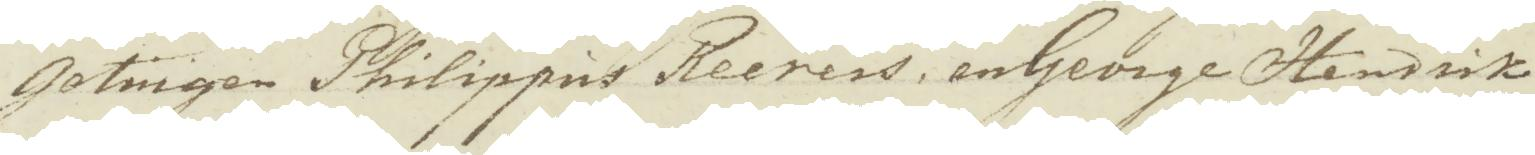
Getuigen Philippus Reevers, en George Hendrik
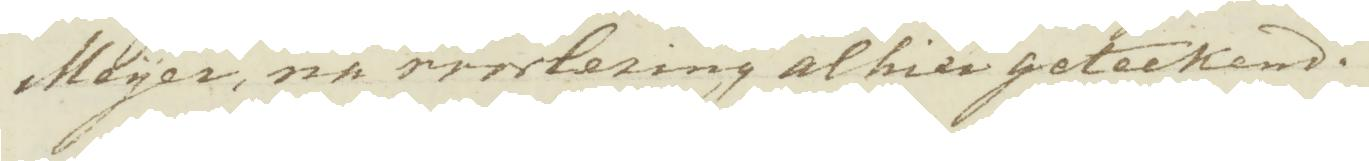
Meijer, na voorlezing alhier geteekend.
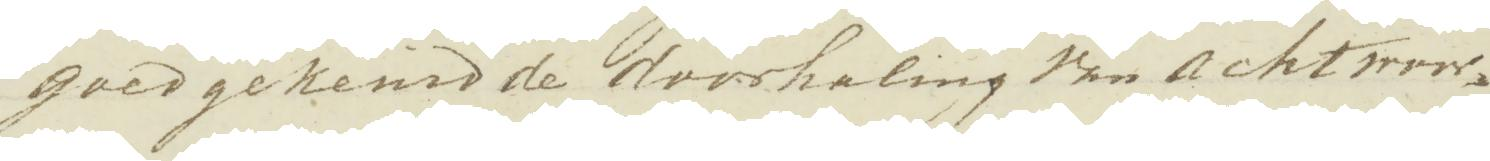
goed gekeurd de doorhaling van acht woor„
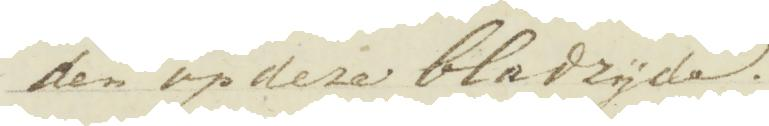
den op deze bladzijde.
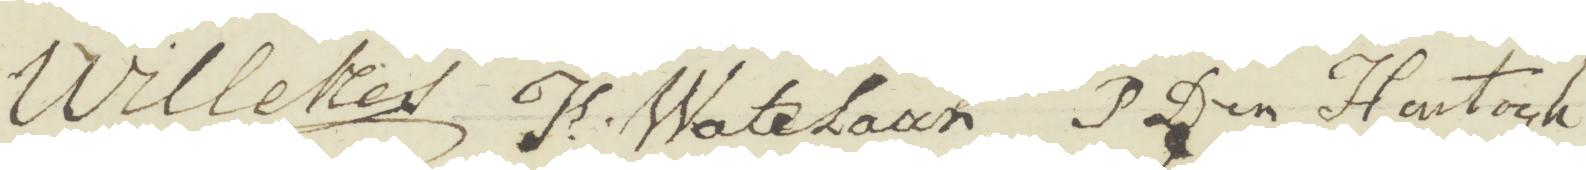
Willekes J:s Watelaar P Den Hartogh
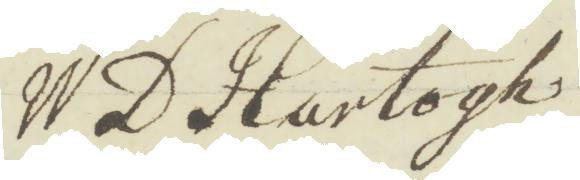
W D Hartogh
